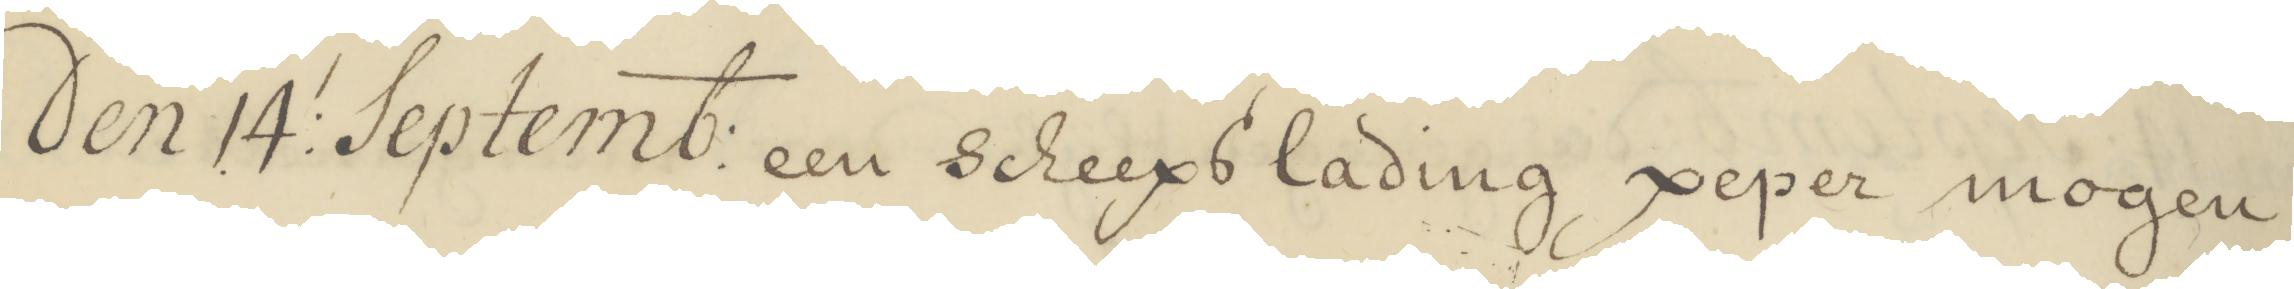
den 14': Septemb: een scheepslading peper mogen
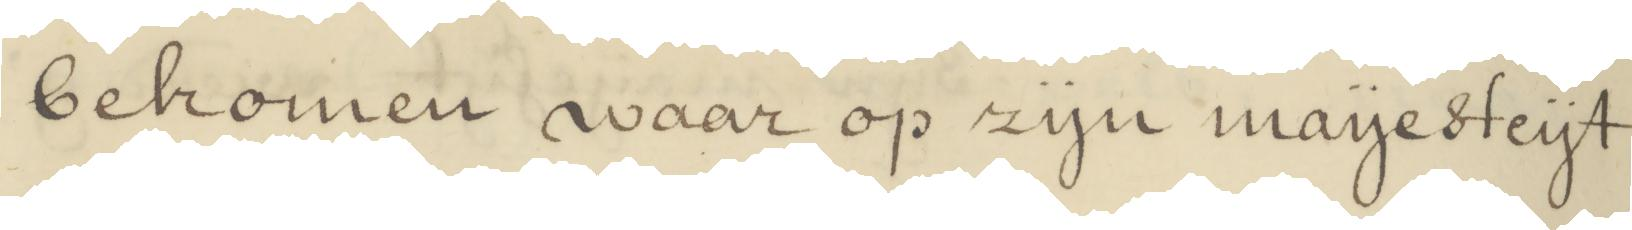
bekomen waar op zijn maijesteijt
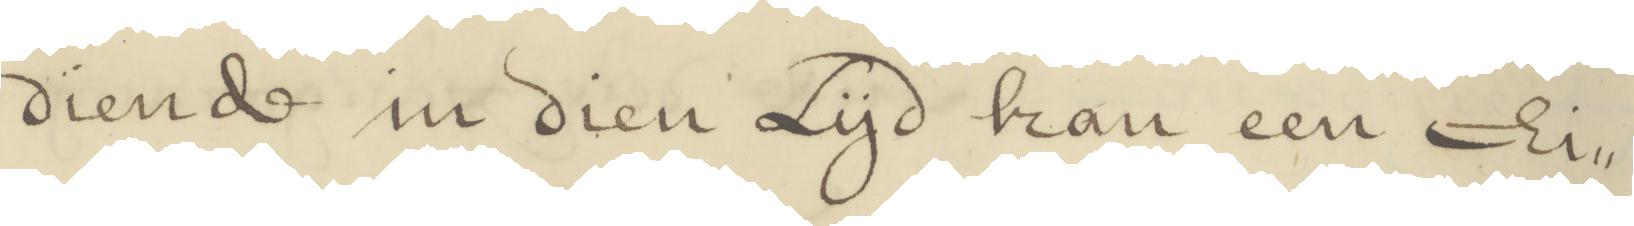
dien de in dien lijd kan een chi„
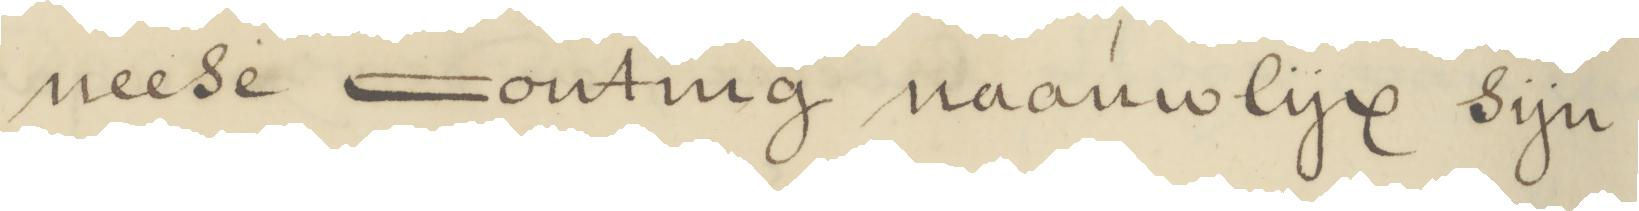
neese conting naauwlijx sijn
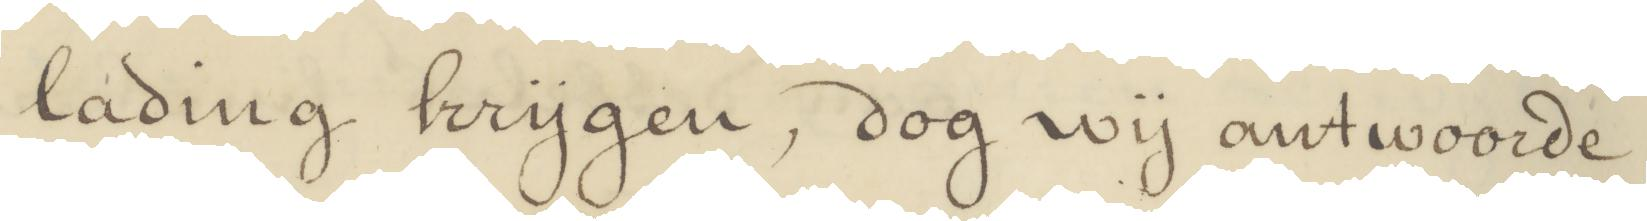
lading krijgen, dog wij antwoorde
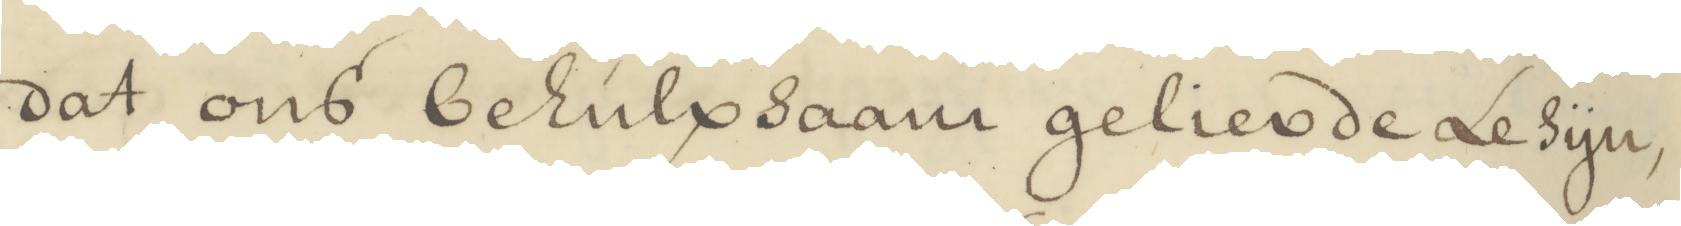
dat ons behulpsaam gelievde te sijn,
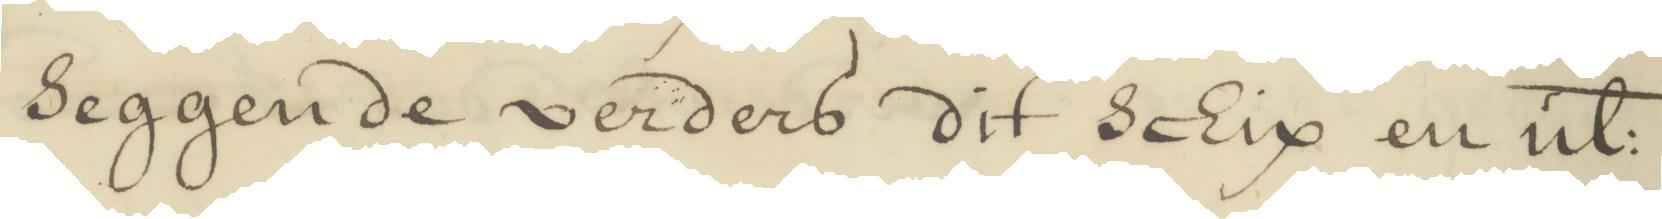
seggende verders dit schip en ul:
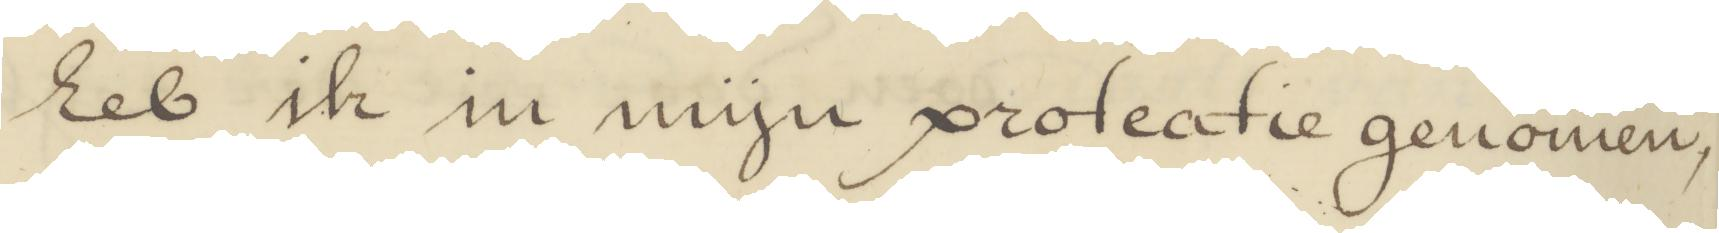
heb ik in mijn protectie genomen,
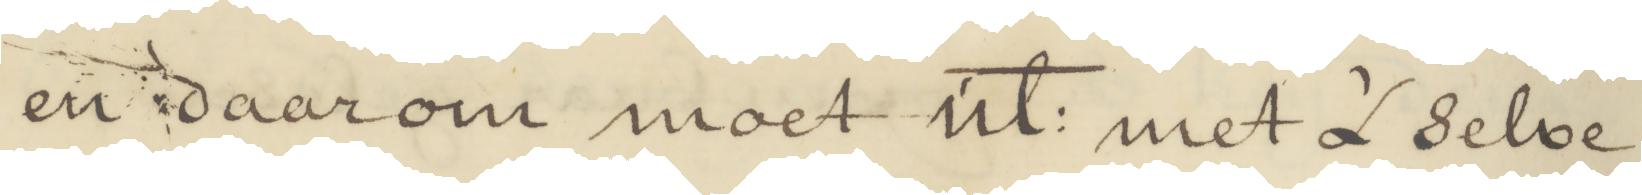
en daar om moet ul: met 't selve
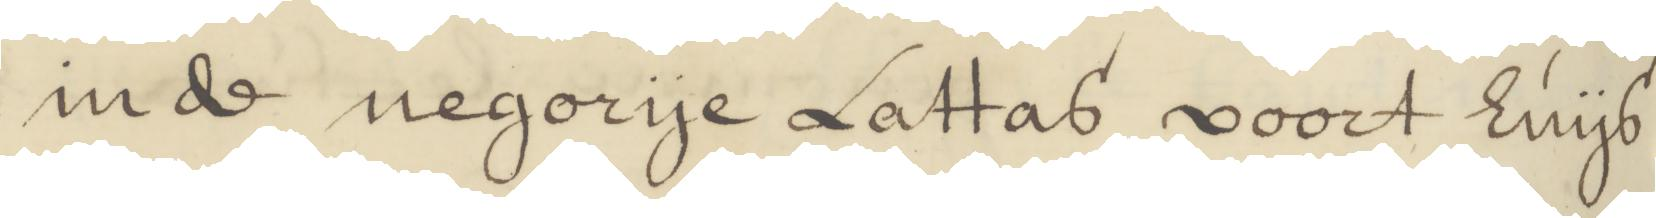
in de negorije tattas voort huijs
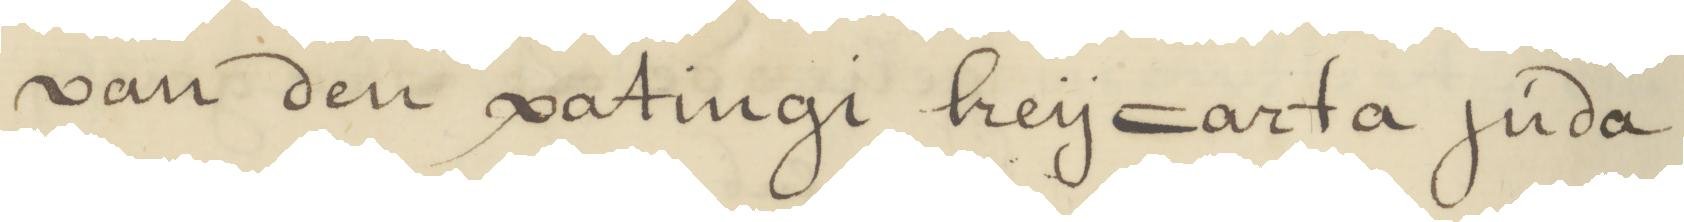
van den patingi keijcarta juda
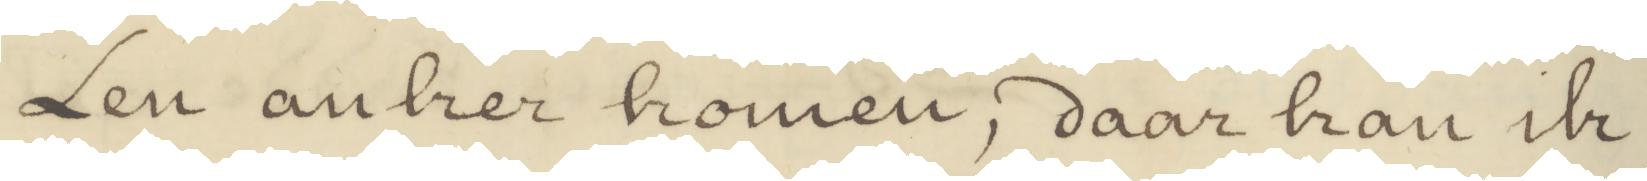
ten anker komen, daar kan ik
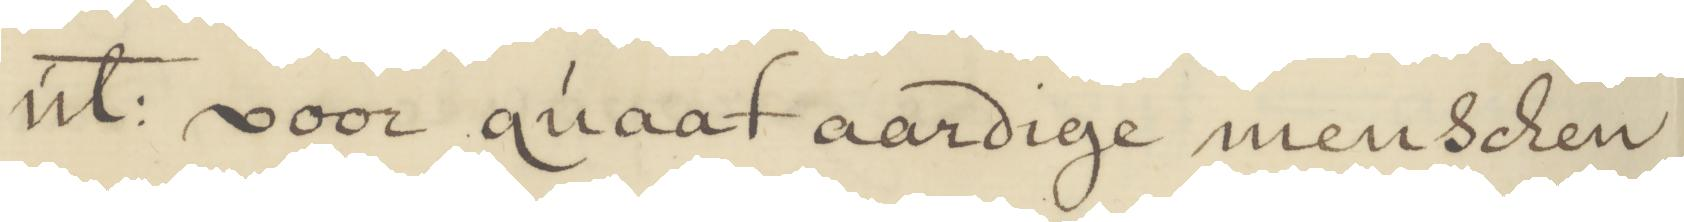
ul: voor quaat aardige menschen
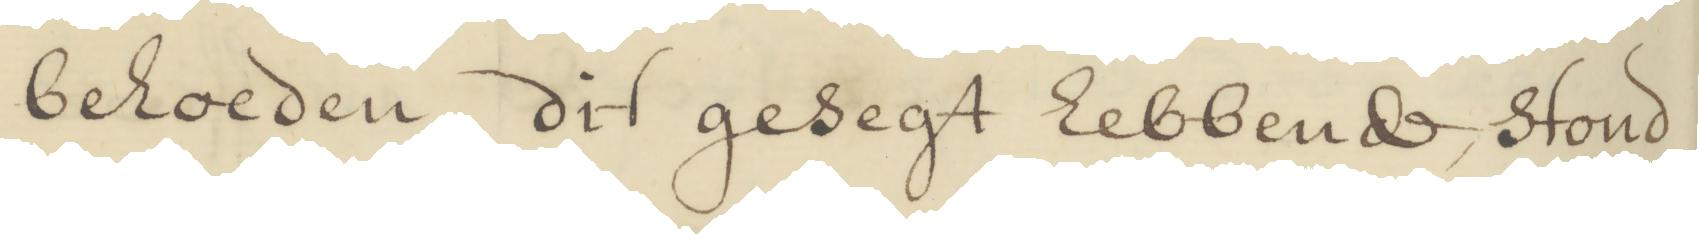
behoeden, dit gesegt hebbende, stond
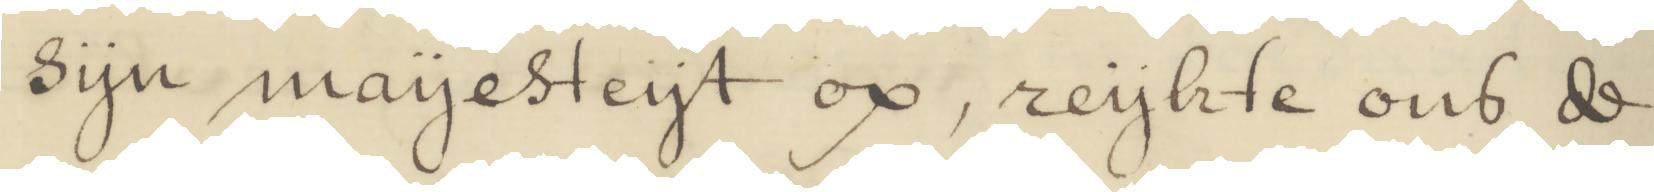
sijn maijesteijt op, reijkte ons de
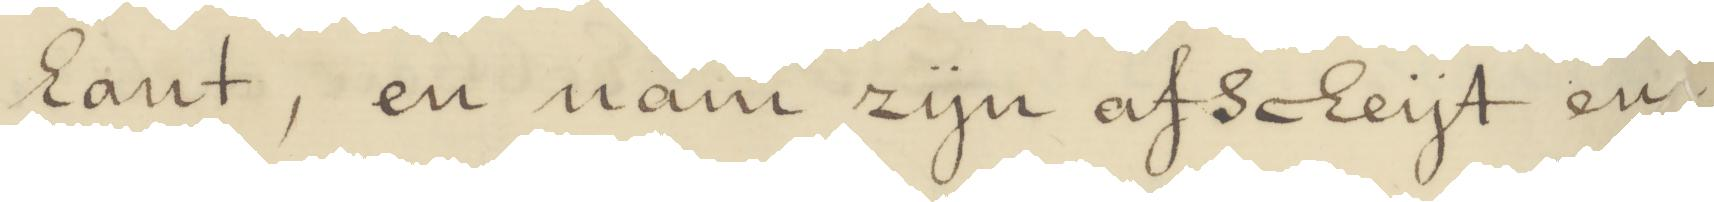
hant, en nam zijn afscheijt en
